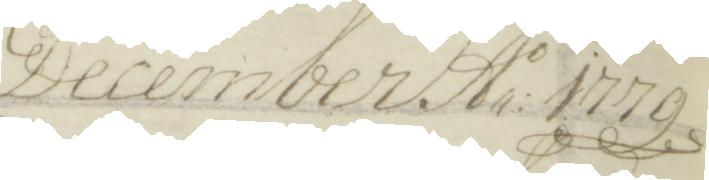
December A„:o 1779
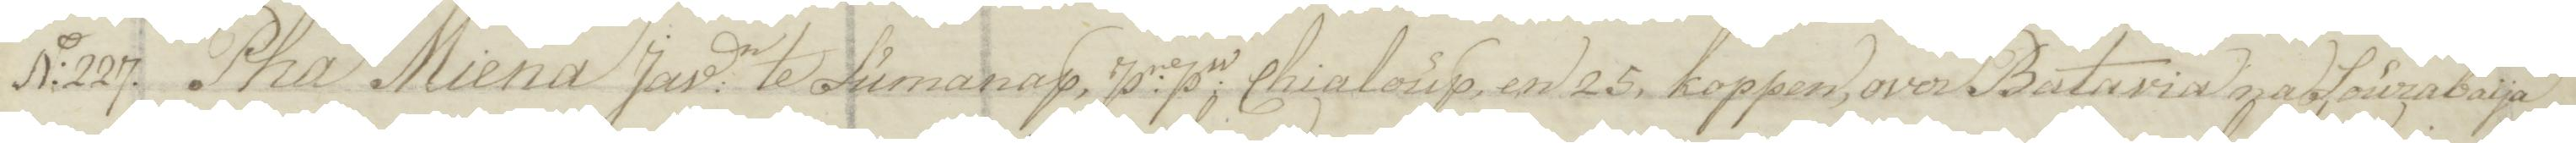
N:o 227: Pha Miena Jav:n te Sumanap, p:r p:w Chialoup, en 25. koppen, over Batavia na Sourabaija
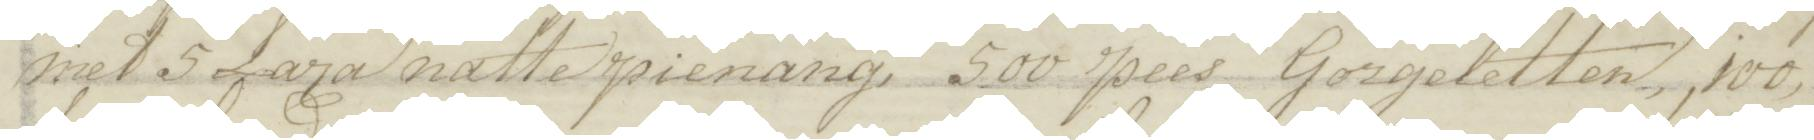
met 5 Laxa natte pienang, 500 pees Gorgeletten, 100,
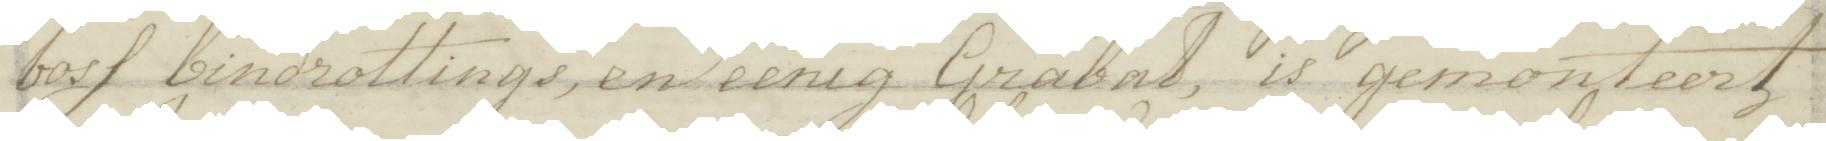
boss bindrottings, en eenig Grabat, is gemonteert
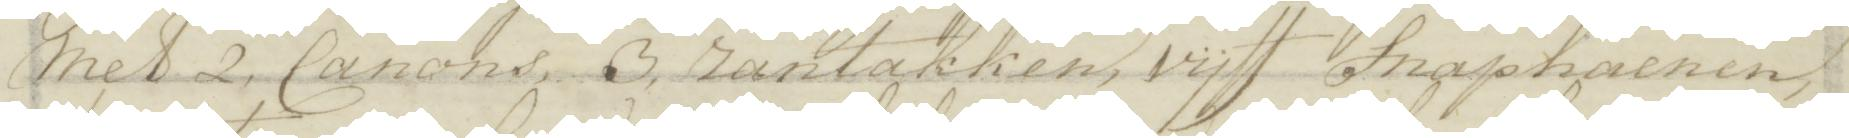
met 2. Canons 3, rantakken, vijf snaphaenen,
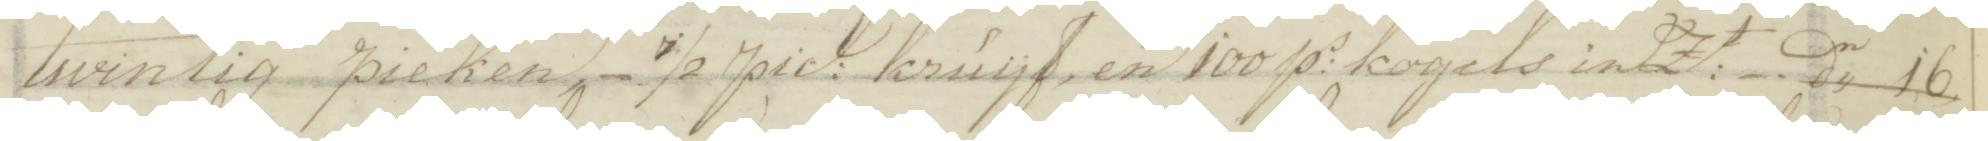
twintig pieken,-½ pic:l kruijt en 100 p:s kogels in Z:t d„n 16.
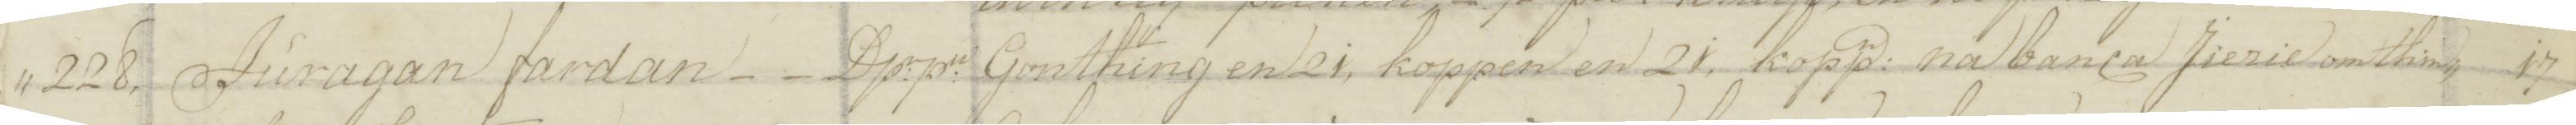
„ 228. Auragan fardan - - Dp:r p:w Gonthing en 21, koppen en 21. kopp:n na banca Jierie om thin „ 17
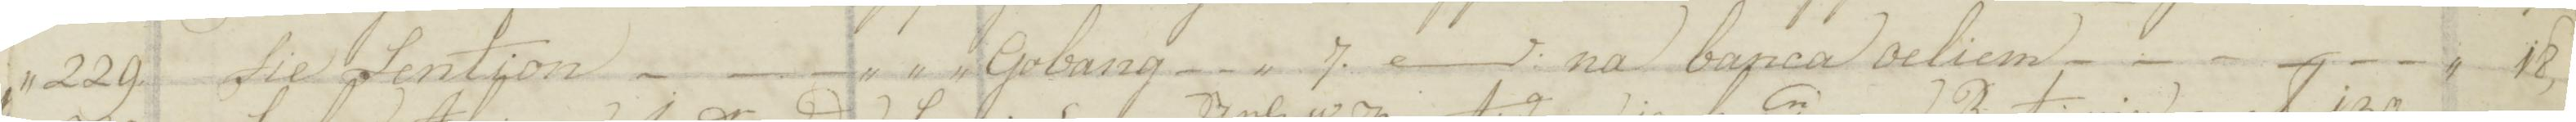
„ 229: sie Sention - - - „ „ „ Gobang „ „ „ 7: _: na banca oeliem - - - - - - „ 18,
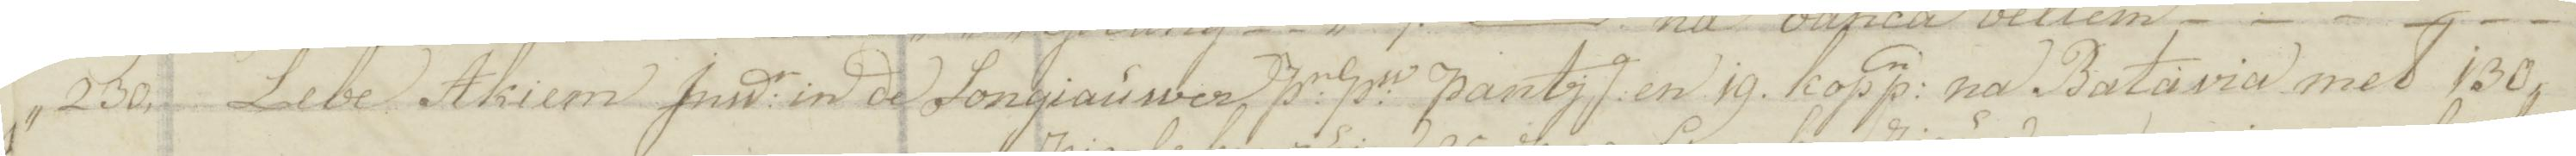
„ 230. Lebe Akiem Jnw:r in de Songiauwer, p:r p:w pantjg en 19. kopp:n na Batavia met 130,
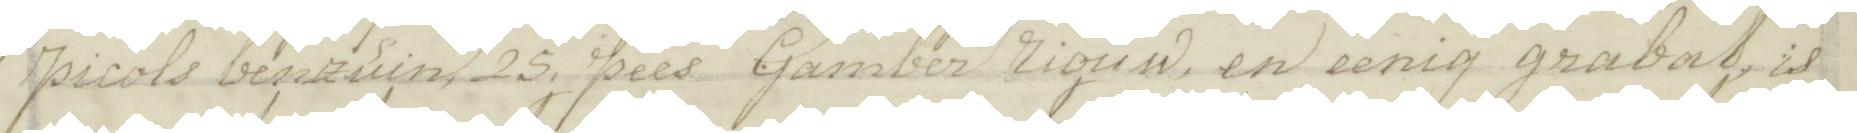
picols benzuin, 25. pees Gamber riouw, en eenig grabat, is
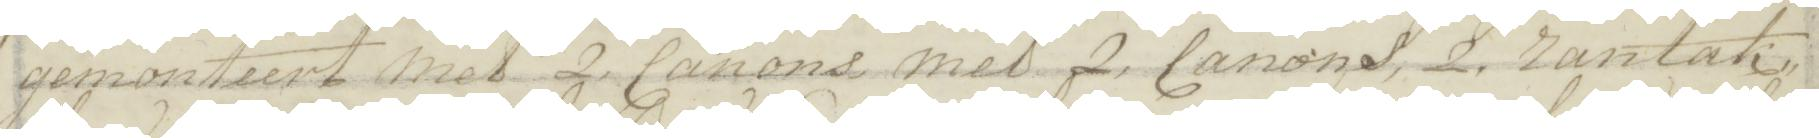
gemonteert met 2 Canons met 2. Canons, 2. rantak„
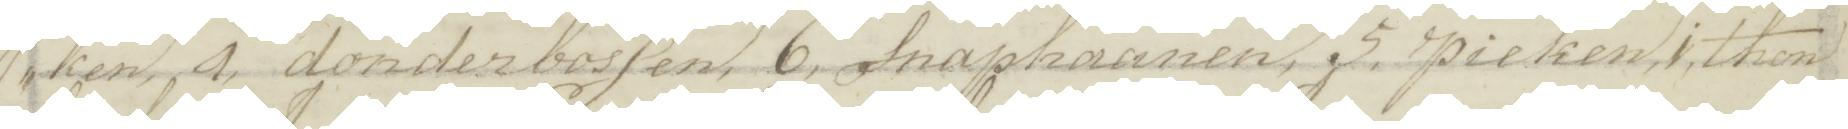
„ken, 4, donderbossen, 6. snaphaanen, 5. Pieken, 1, thon
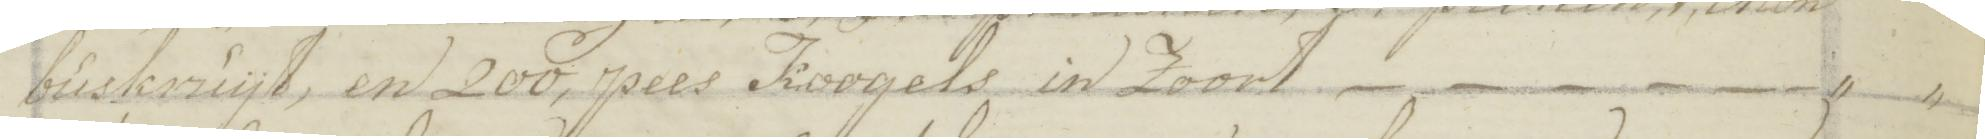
buskruijt, en 200, pees Koogels in zoort - - - - - - „ „
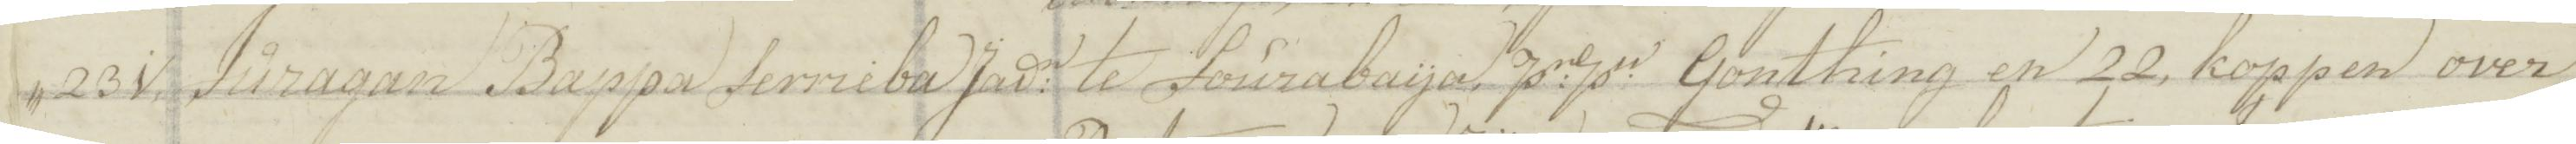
„ 231, Iuragan Bappa serrieba Jav:n te Sourabaija p:r p:w Gonthing en 22. koppen over
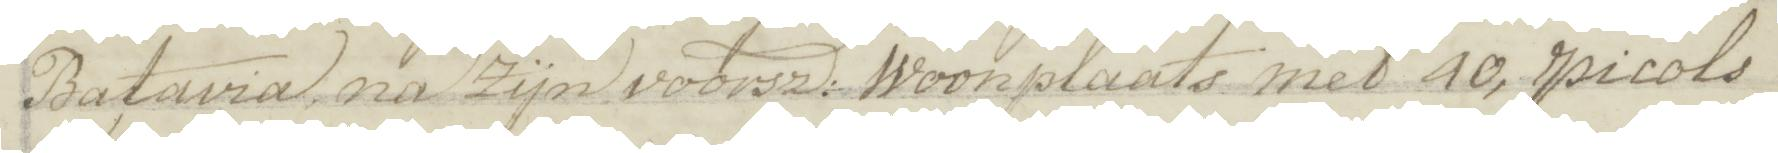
Batavia na zijn voorsz: Woonplaats met 40. picols
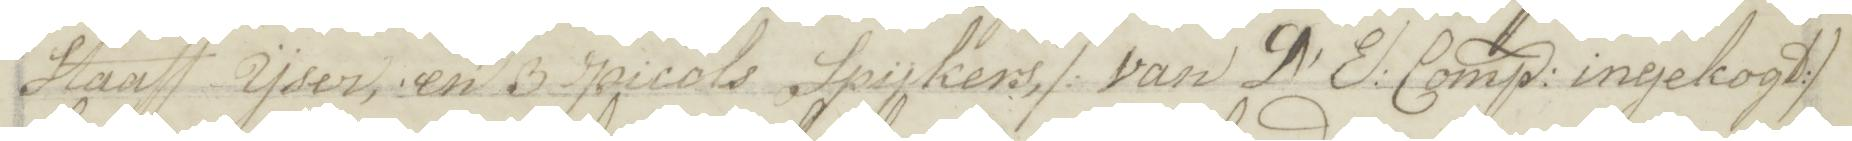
staaff ijser, en 3 picols Spijkers /: van D E: Comp:s ingekogt:/
